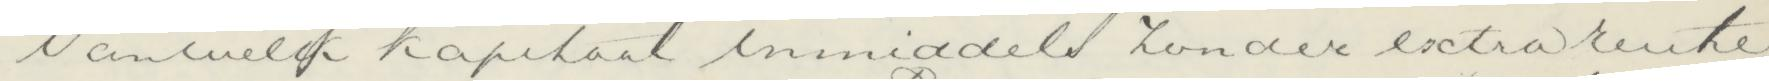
Van welk kapitaal inmiddels zonder extra rente
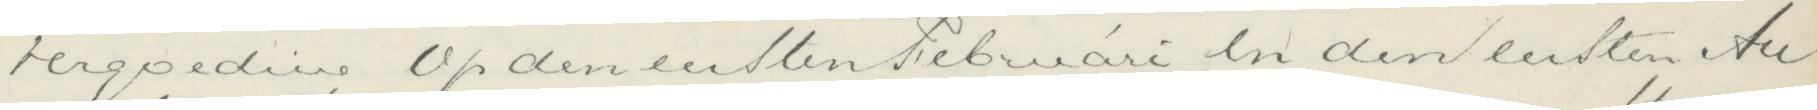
vergoeding op den eersten Februari en den eersten Au
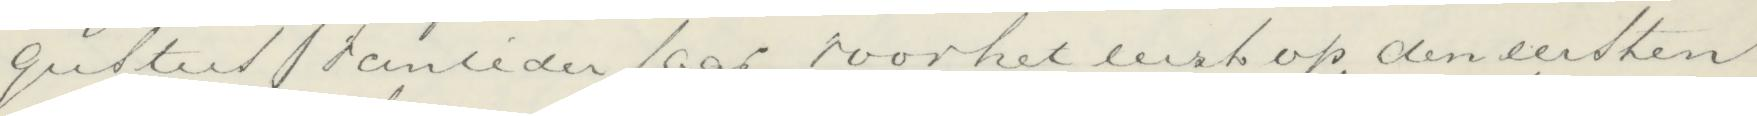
gustus van ieder jaar voor het eerst op den eersten
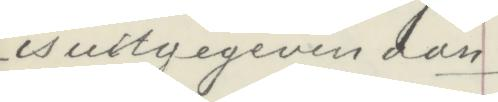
is uitgegeven aan
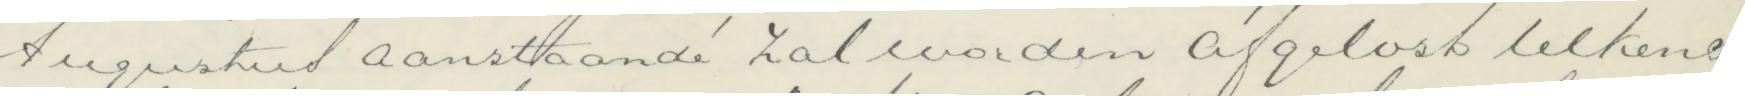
Augustus aanstaande zal worden afgelost telkens
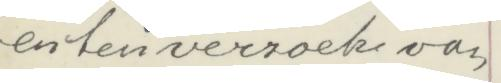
en ten verzoeke van
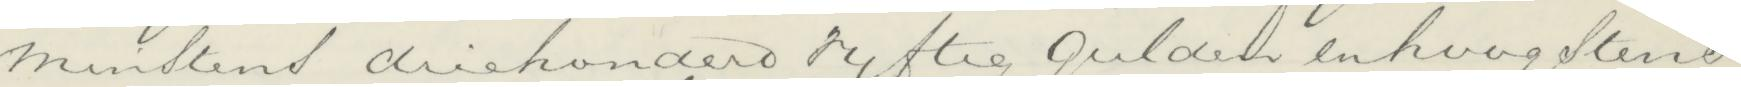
minstens drie honderd vyftig Gulden en hoogstens
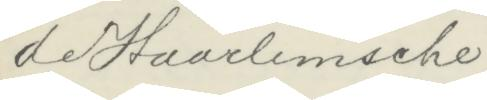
de Haarlemsche
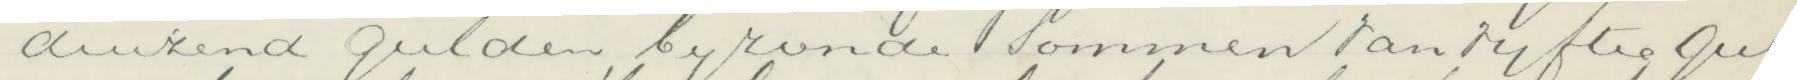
duizend Gulden, by ronde sommen van vyftig Gul
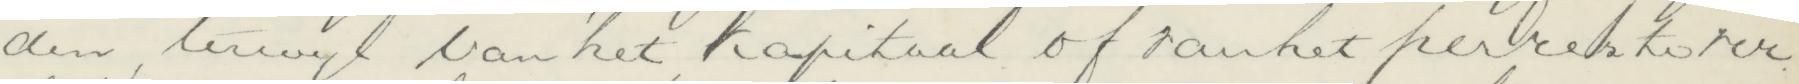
den terwyl van het kapitaal of van het per reste ver
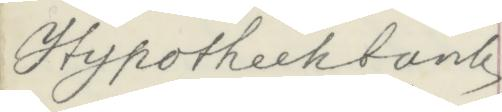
Hypotheekbank
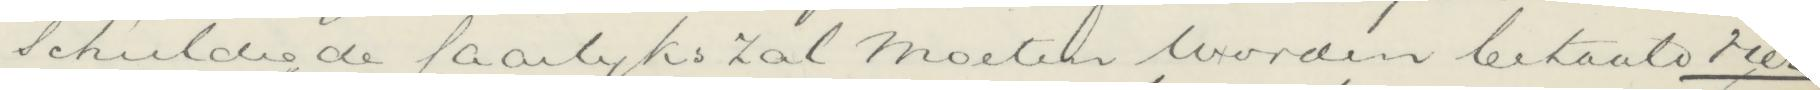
schuldigde jaarlyks zal moeten worden betaald vier
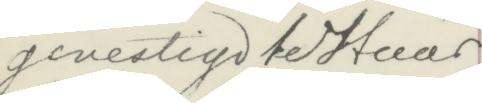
gevestigd te Haar
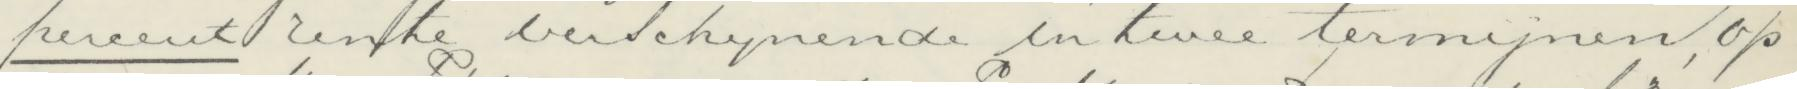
percent rente verschynende in twee termijnen, op
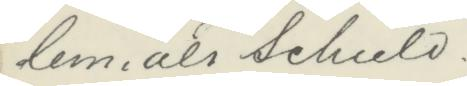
lem, als schuld
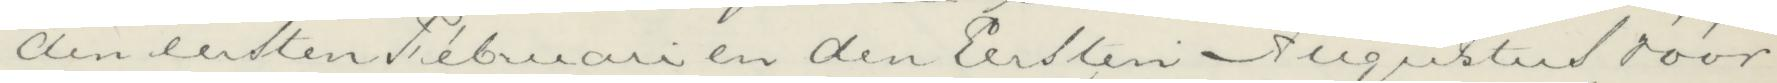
den eersten Febuari en den Eersten Augustus voor
